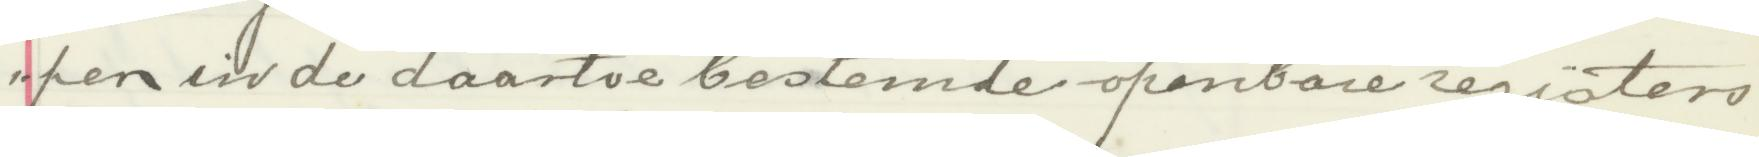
„per in de daartoe bestemde openbare registers
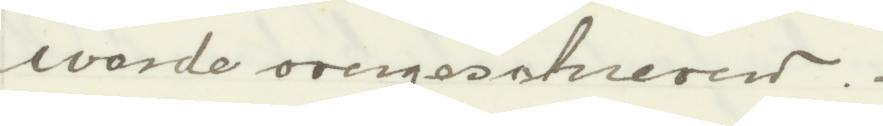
worde overgeschreven.
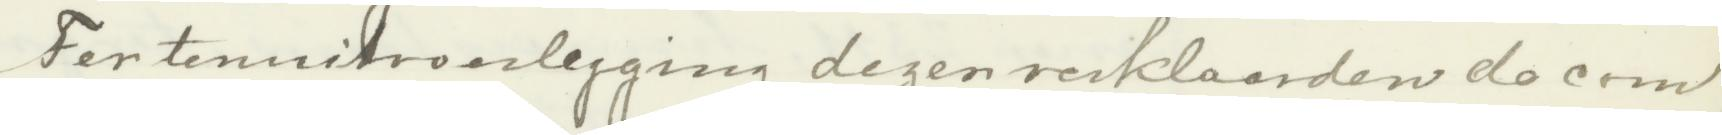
Ter tenuitvoerlegging dezer verklaarden de com
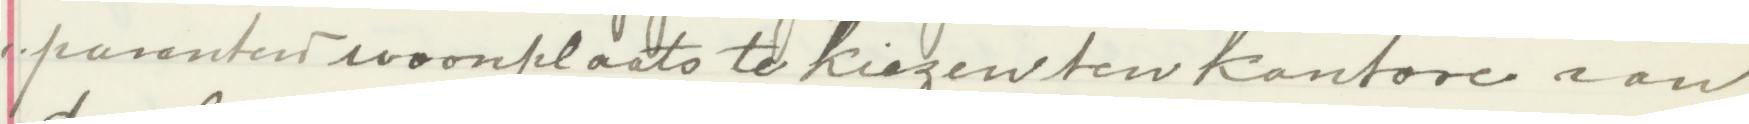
„paranten woonplaats te kiezen ten kantore van
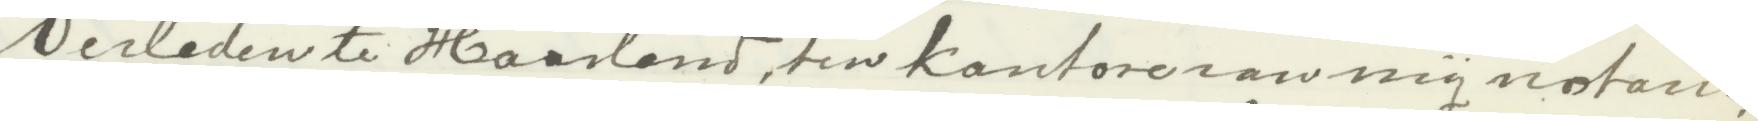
Verleden te Haarlem, ten kantore van mij notaris,
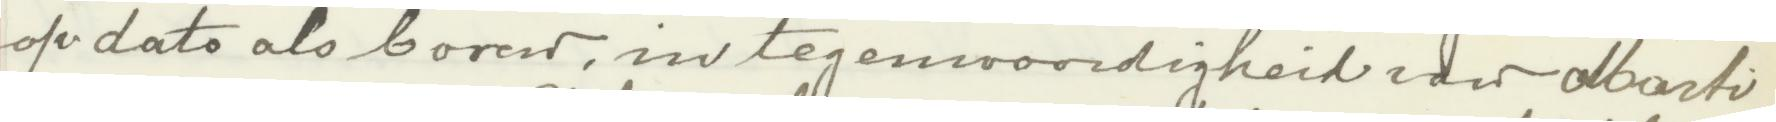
op dato als boven, in tegenwoordigheid van Marti
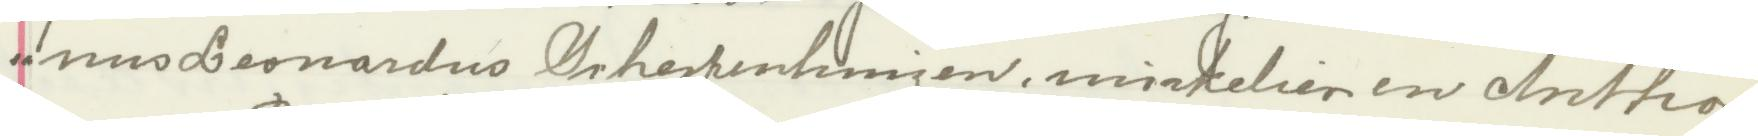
„nus Leonardus Scherpenhuizen, winkelier en Antho
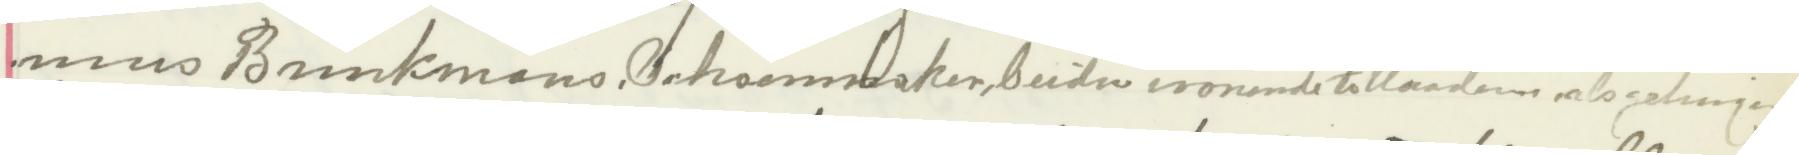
nius Brinkmans, Schoenmaker, beiden wonende te Haarlem, als getuigen
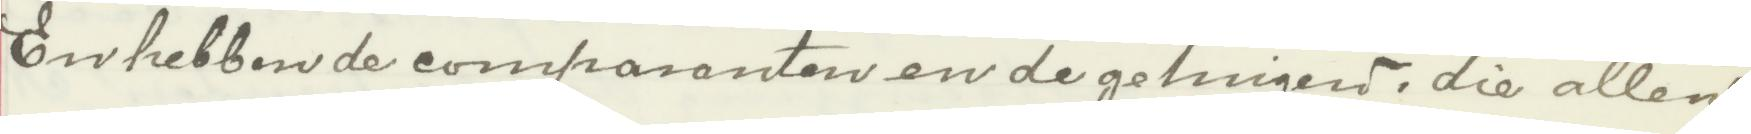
En hebben de comparanten en de getuigen, die allen
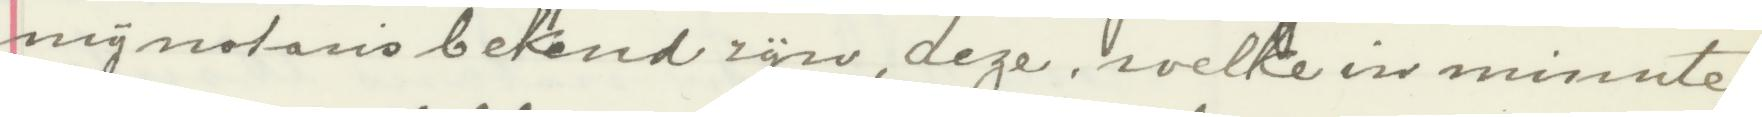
mij notaris bekend zijn, deze, welke in minute
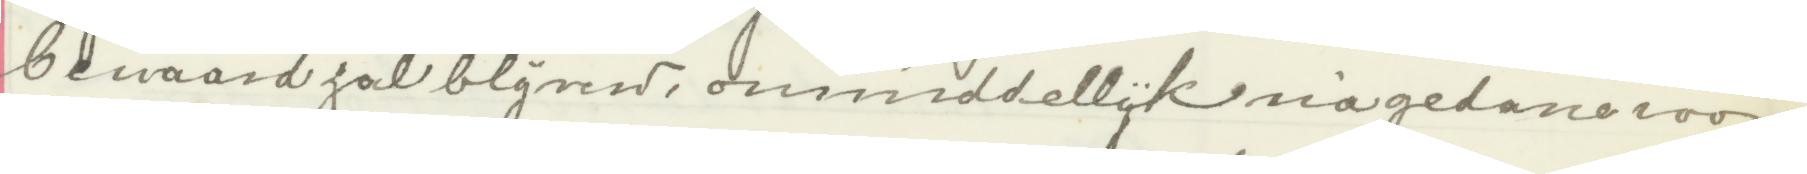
bewaard zal blijven, ommiddellijk na gedane voor
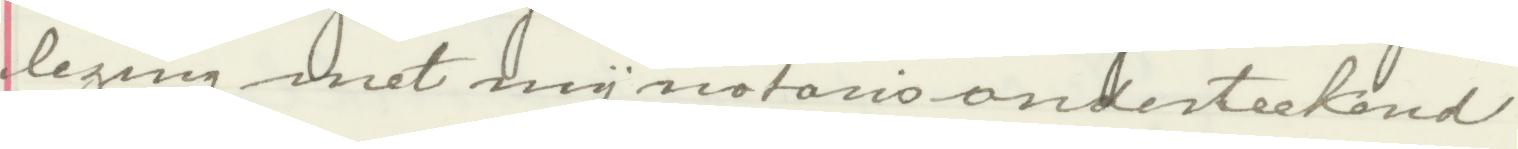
lezing met mij notaris onderteekend
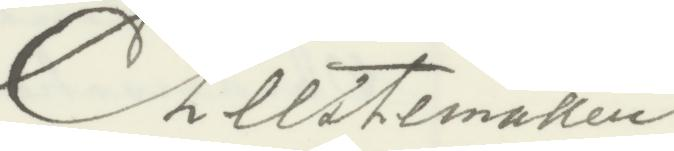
E Leestemaker
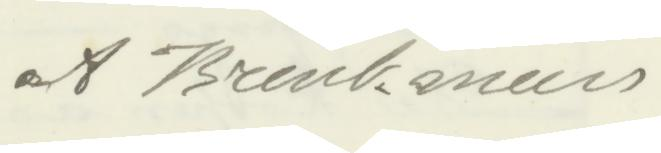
A Brinkman
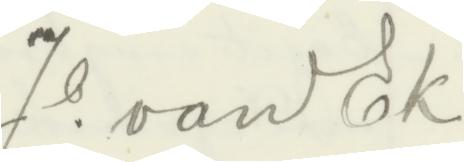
J.b van Ek
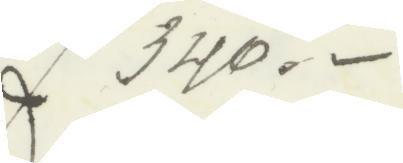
ƒ 340. —
